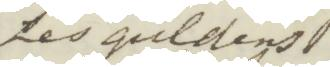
zes guldens
